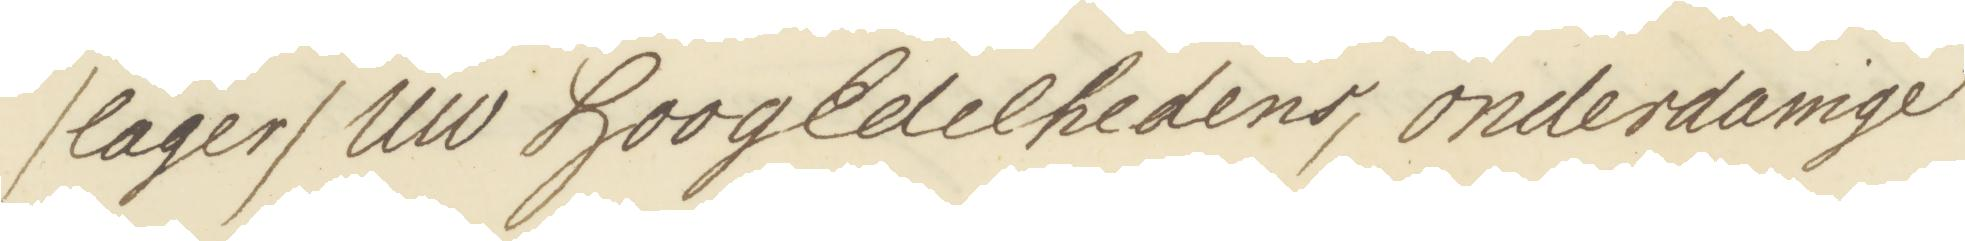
/lager/ uw Hoog Edelhedens, onderdanige
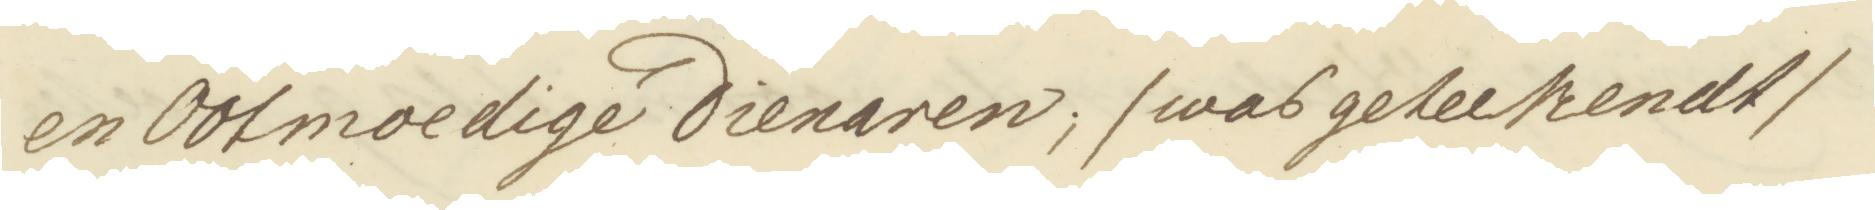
en Ootmoedige dienaren; /was geteekendt/
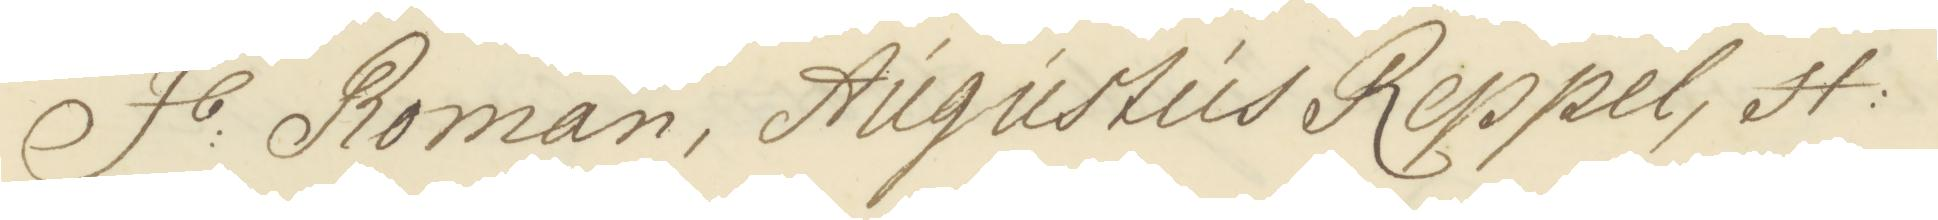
J:b Roman, Augustus Reppel, H:
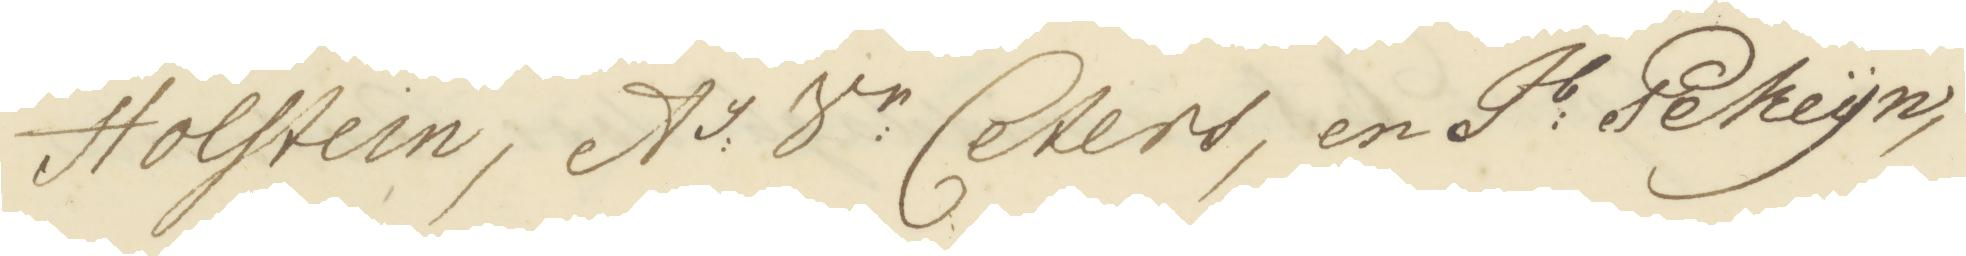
Holstein, A:y V:n Ceters, en J:b Pekeijn,
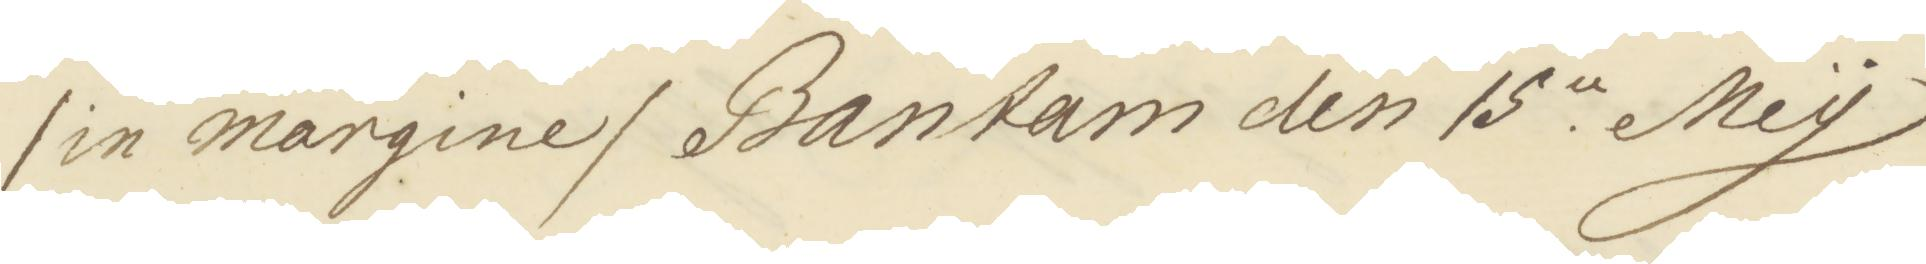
/in margine/ Bantam den 15.e Meij
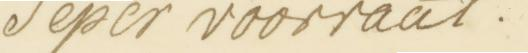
Peper voorraat
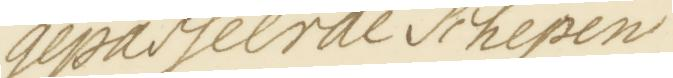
gepasseerde Schepen
